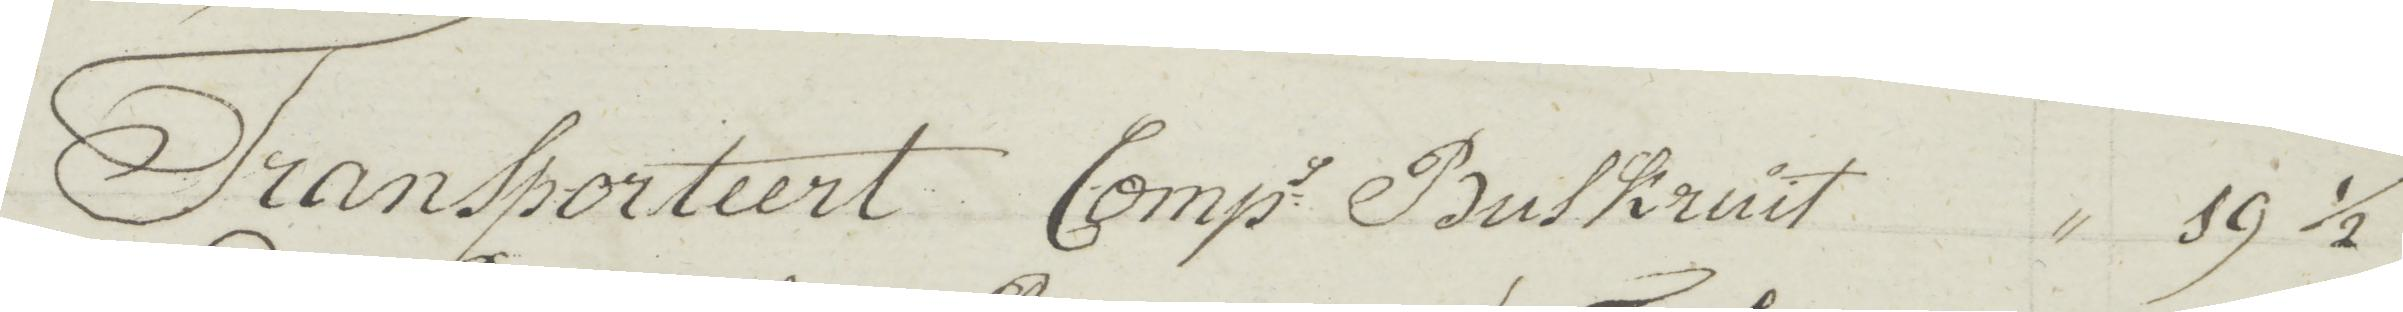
Transporteert Comp:s Buskruit „19 ½
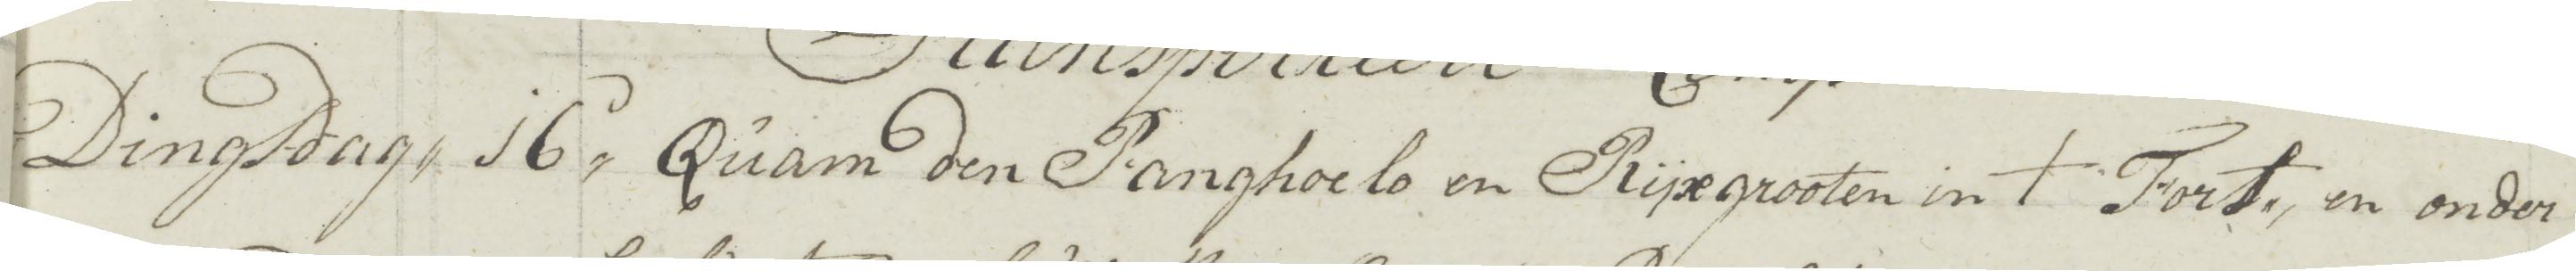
Dingsdag „ 16„d Quam den Panghoelo en Rijxgrooten in t Fort„ en onder
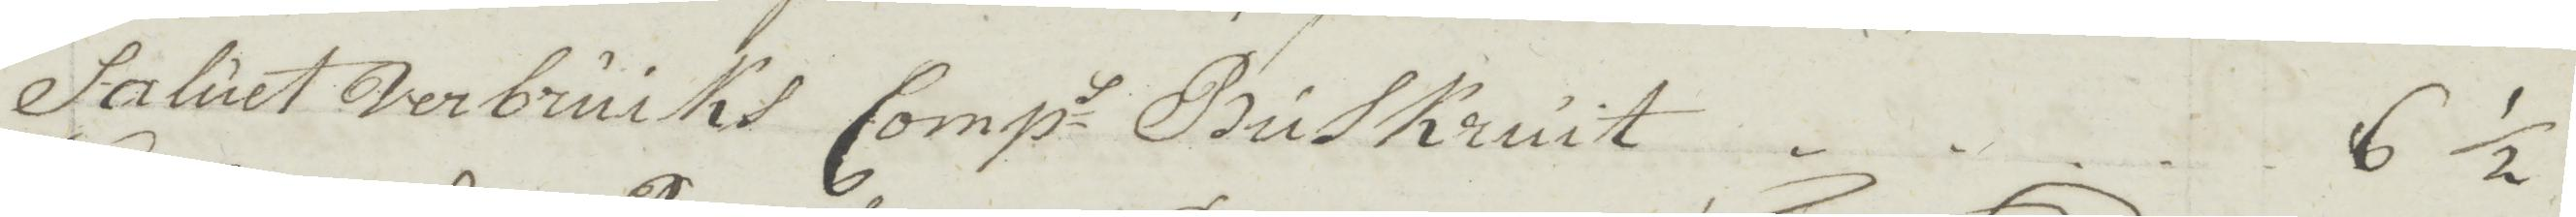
Saluet verbruiks Comp=s Buskruit - - - - - 6 ½
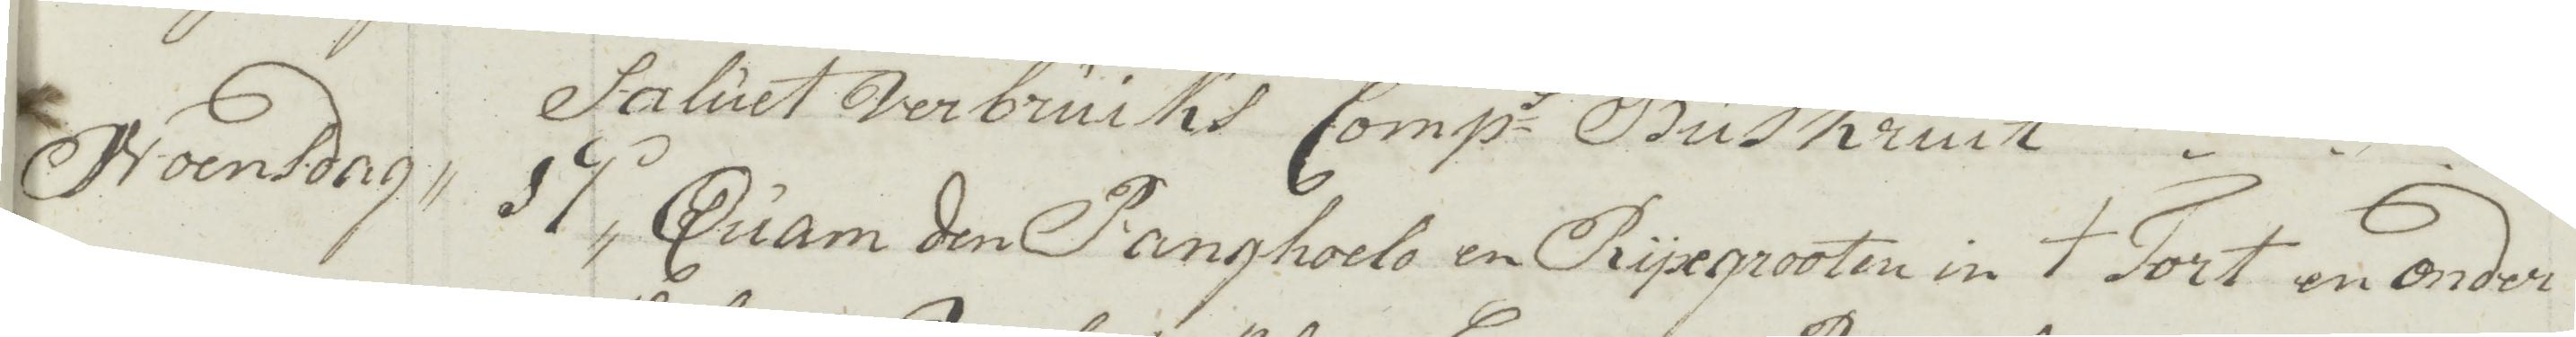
Woensdag „ 17„' Quam den Panghoelo en Rijxgrooten in t Fort en onder
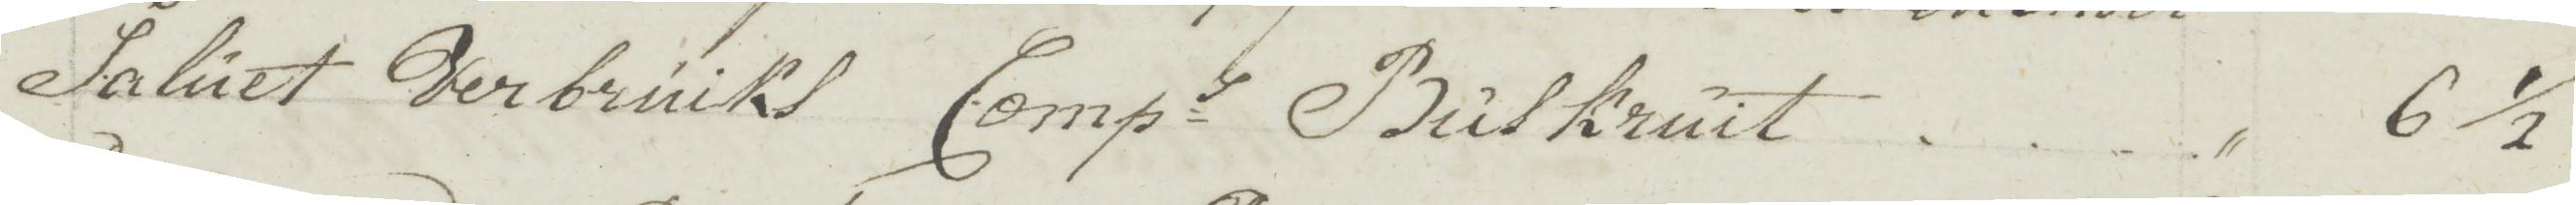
Saluet Verbruiks Comp=s Buskruit - - - - „ 6 ½
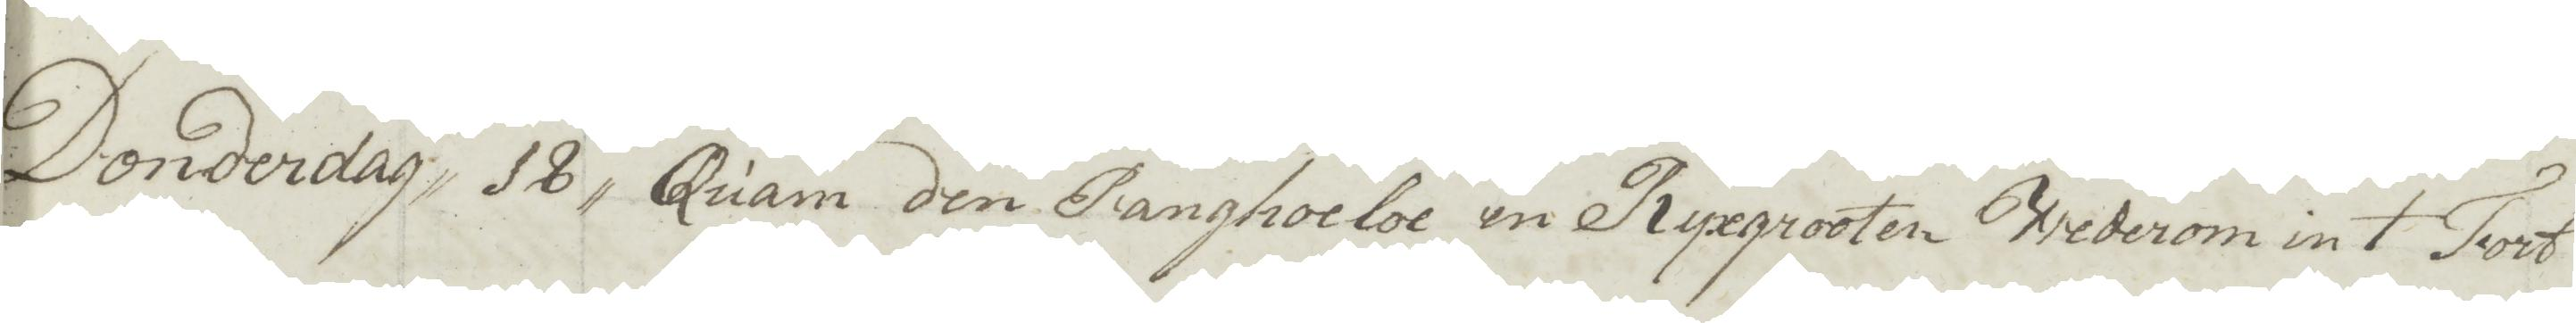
Donderdag„ 18„d Quam den Panghoeloe en Ryxgrooten Wederom in t Fort
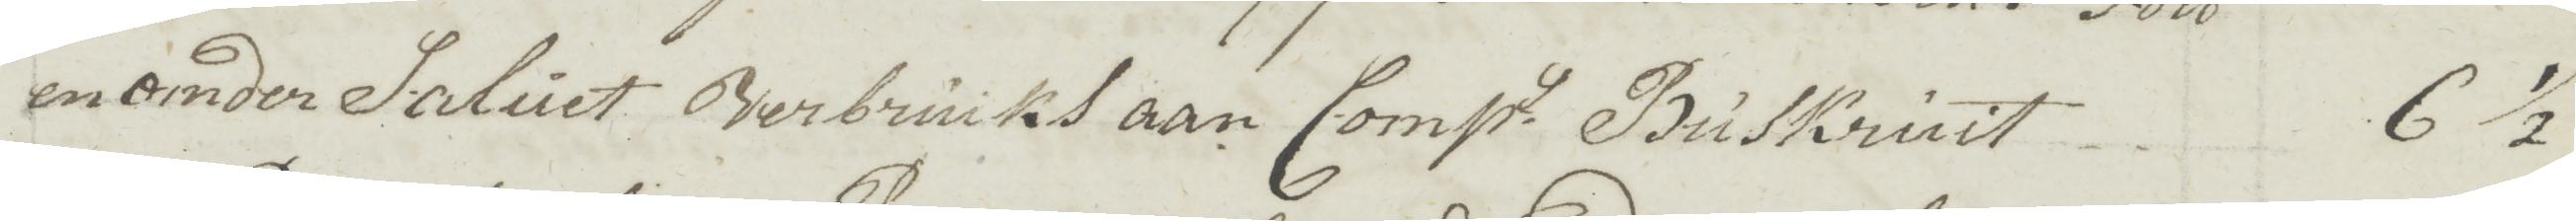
en oinder Saluet verbruiks aan Comp.s Buskruit - - 6 ½
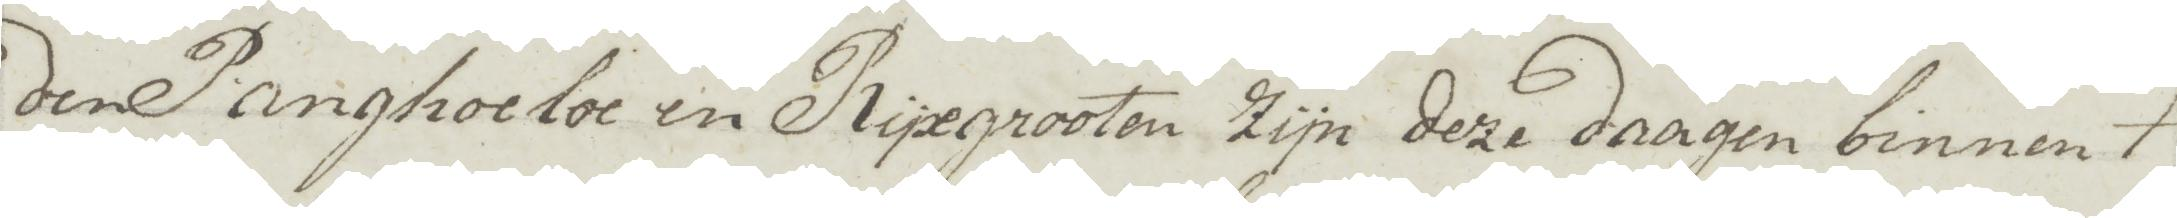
den Panghoeloe en Rijxgrooten zijn deze daagen binnen t
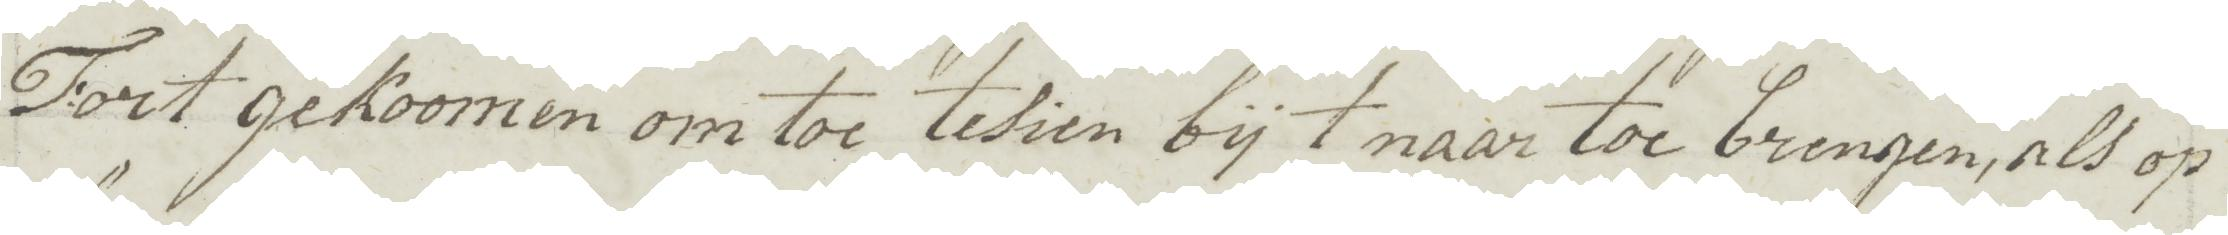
Fort gekoomen om toe tesien bij t naar toe brengen, als op
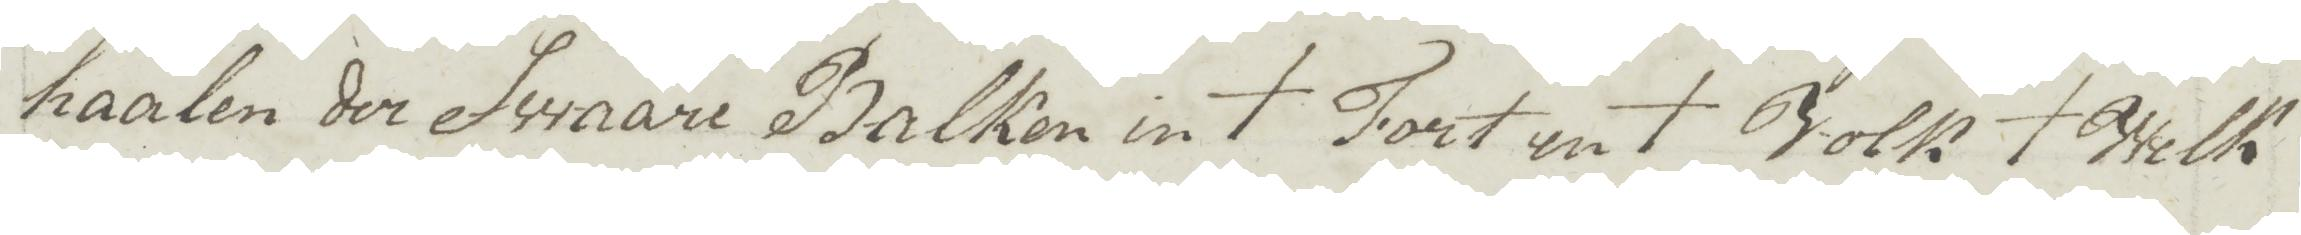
haalen der Swaare Balken in t Fort en t Volk t welk
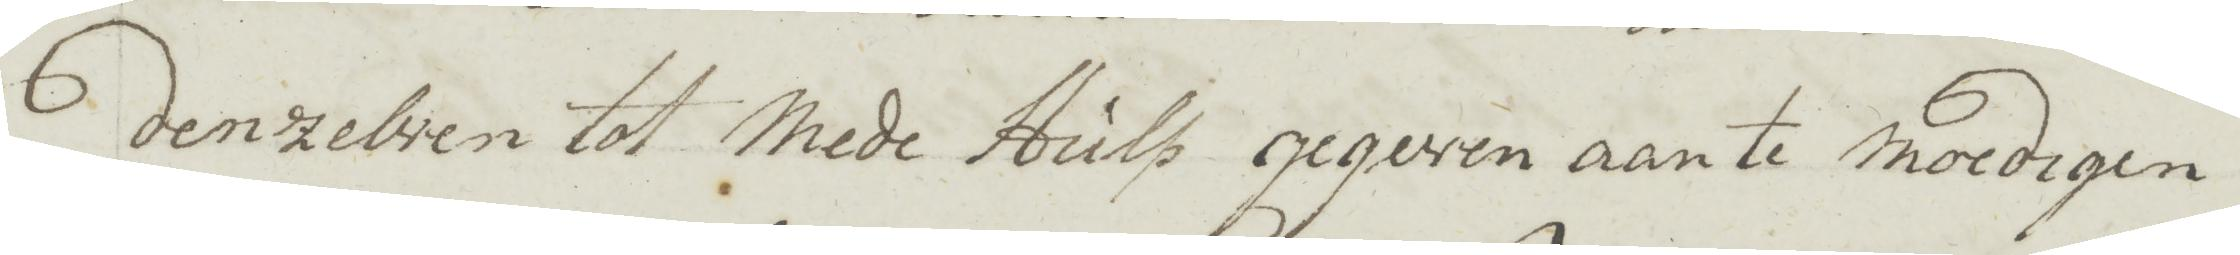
denzelven tot mede Hulp gegeven aan te moedigen
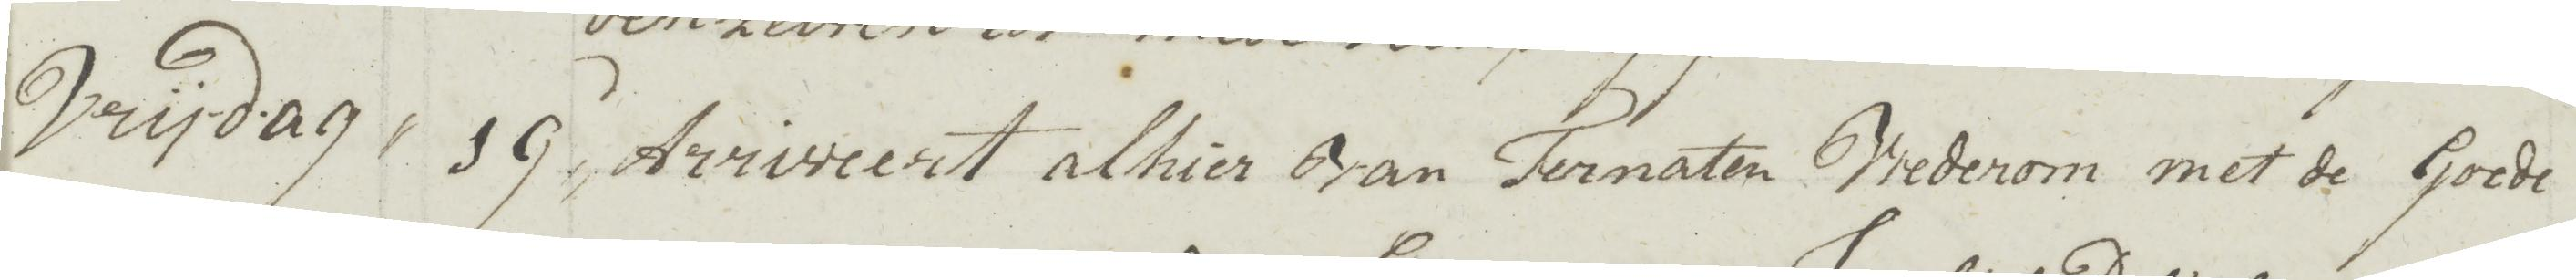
Vrijdag „ 19„' Arriveert alhier van Ternaten Wederom met de Goede
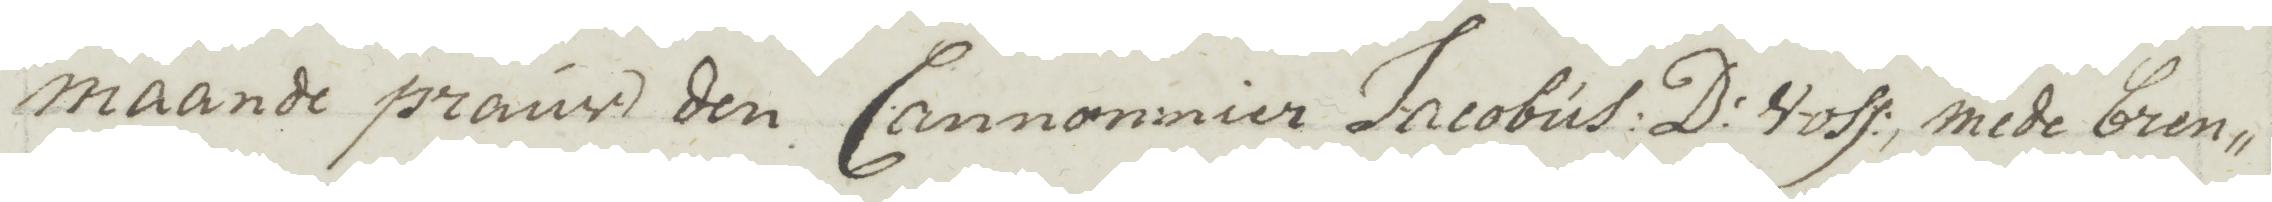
maande prauw den Cannonnier Iacobus: D: voss:, mede bren„
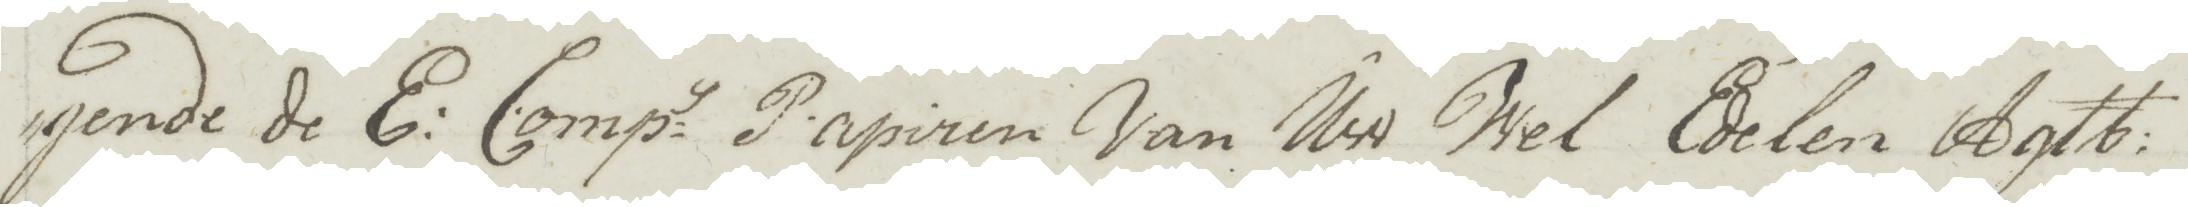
„gende de E: Comp=s Papiren van Uw Wel Edelen Agtb:
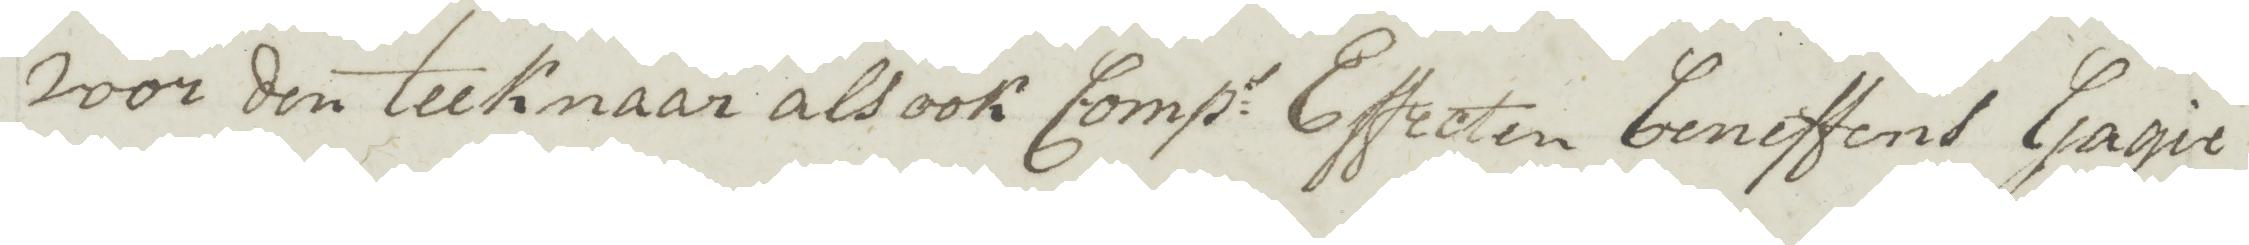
voor den teeknaar als ook Comp:s Effecten beneffens Gagie
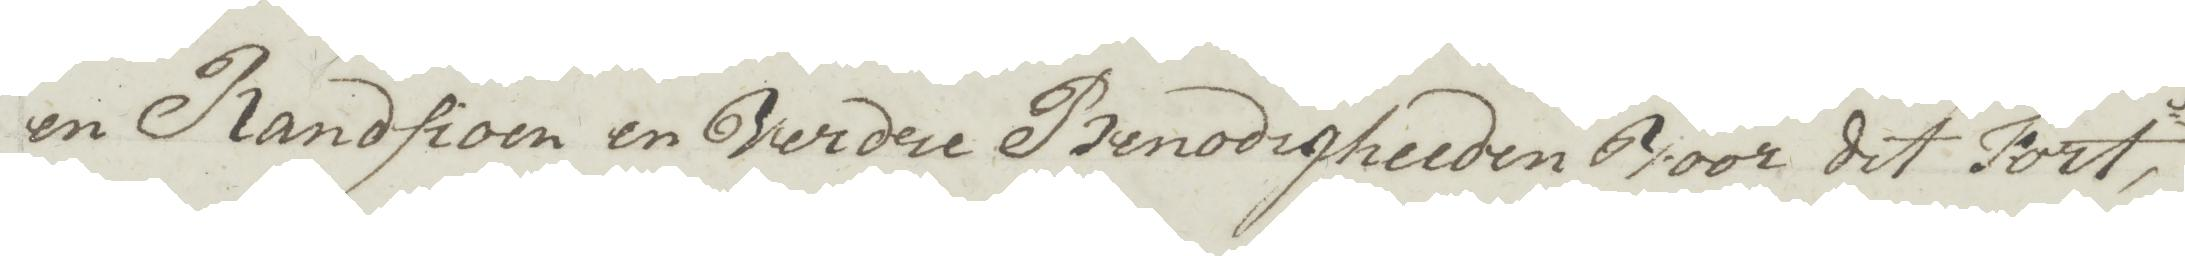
en Randsioen en verdre Benodigheeden voor dit Fort,=s
